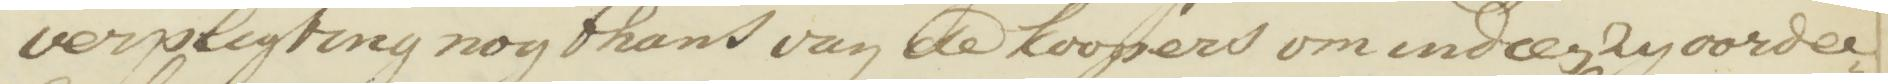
verpligting nog thans van de koopers om indien zy oordee„
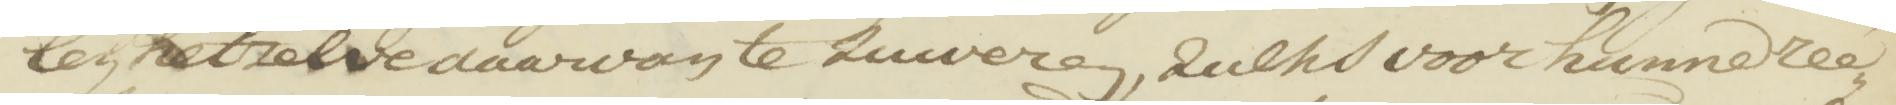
len hetzelve daarvan te zuiveren, zulks voor hunne ree„
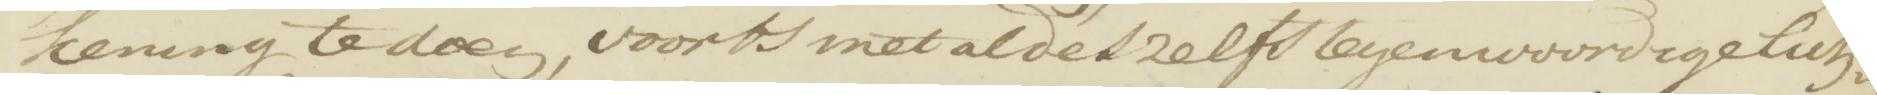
kening te doen, voorts met aldeszelfs tegenwoordige lich„
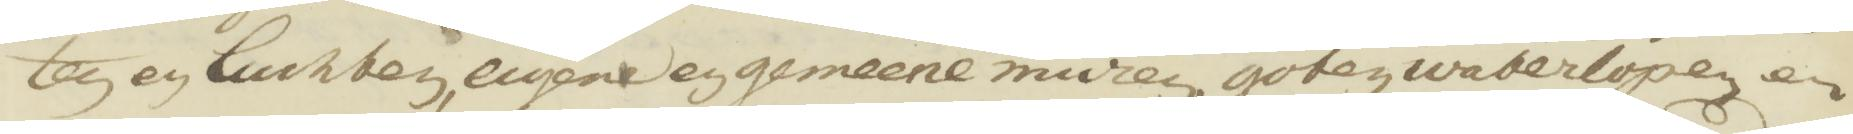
ten en luchten, eigene en gemeene muren, goten waterlopen en
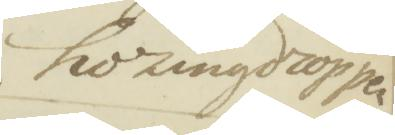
hozingdroppen
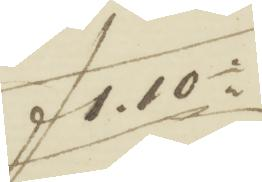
ƒ1:10:
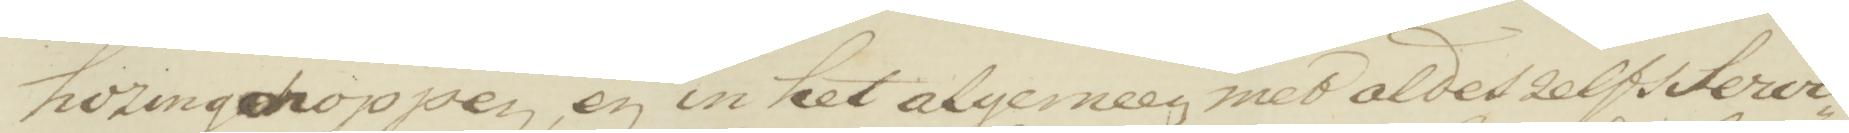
hozingdroppen, en in het algemeen met aldes zelfs servi„
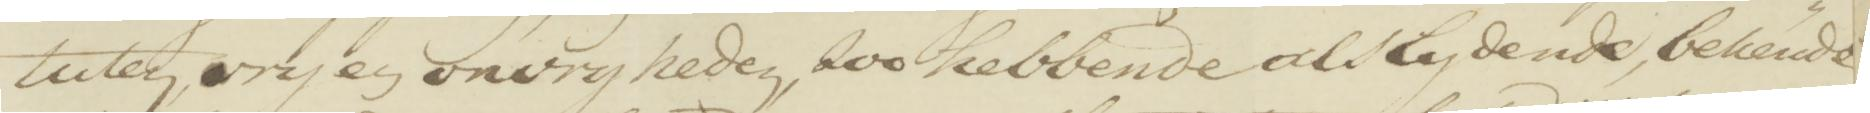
tuten, vry en onvryheden, zoo hebbende als lydende, bekende
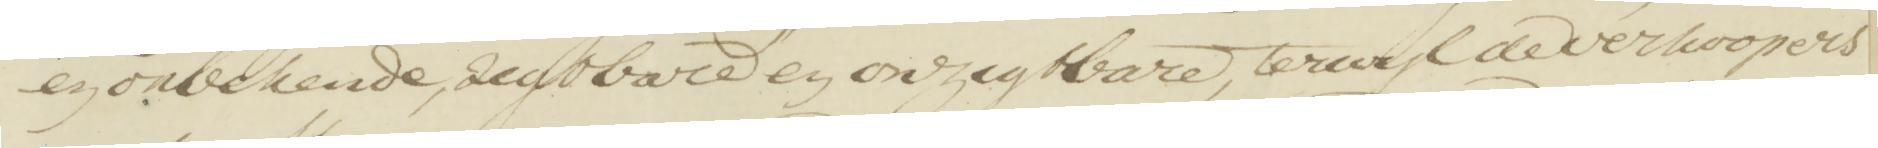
en onbekende, zigtbare en onzigtbare, terwyl de verkoopers
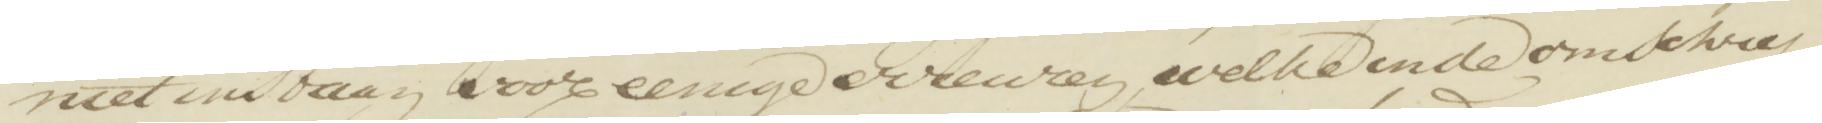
niet instaan voor eenige erreuren welke in de omschry„
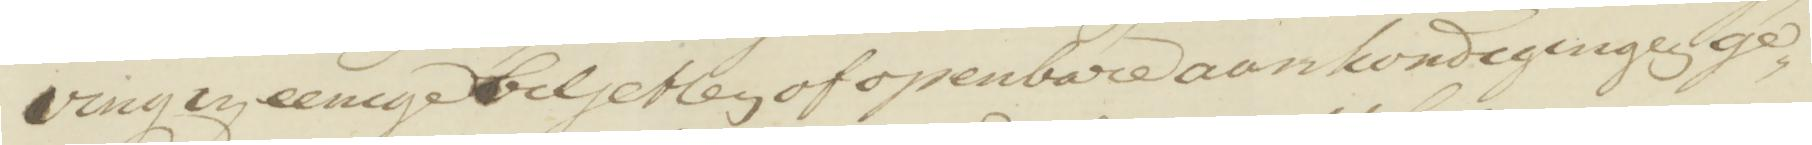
ving in eenige biljetten of openbare aankondigingen ge„
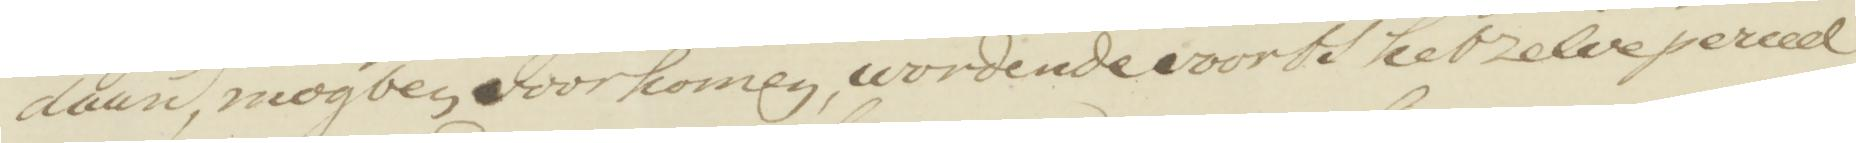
daan, mogten voorkomen, wordende voorts hetzelve perceel
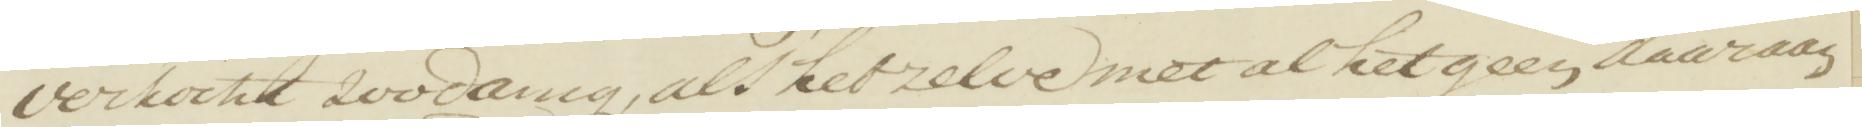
verkocht zoodanig, als het zelve met al het geen daaraan
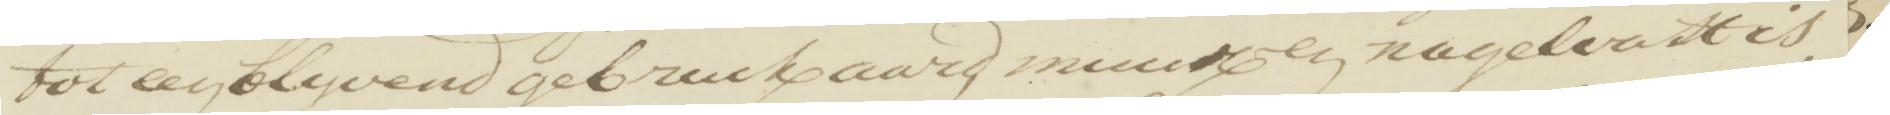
tot een blyvend gebruik aard, muur en nagelvast is,
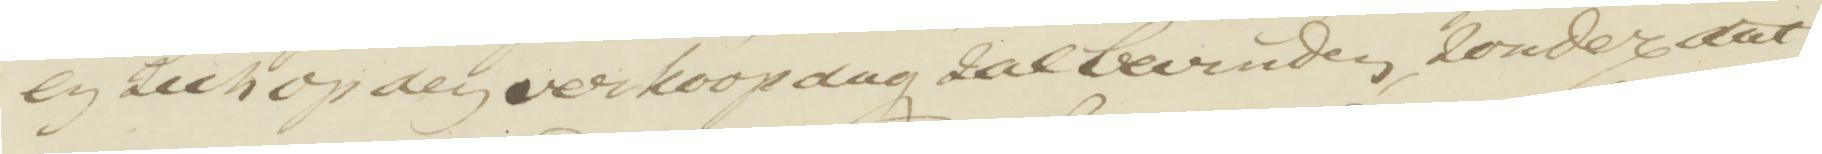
en zich op den verkoopdag zal bevinden zonder dat
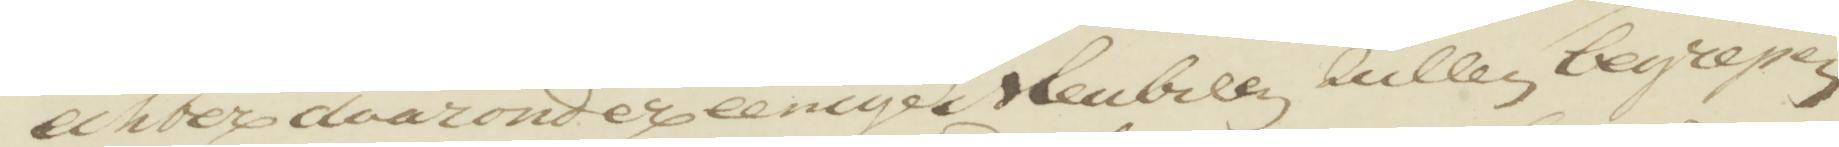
echter daaronder eenige Meubilen zullen begrepen
